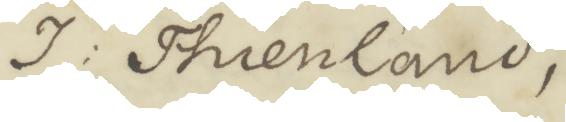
I: Thienland,
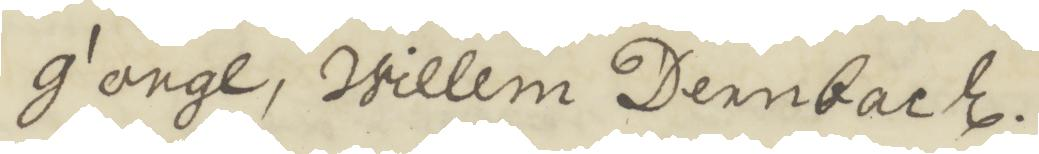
g’orge, Willem Dernbach.
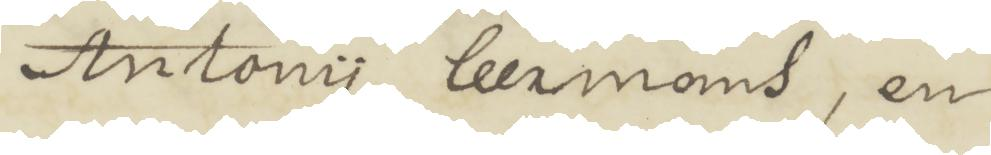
Antonij leermans, en
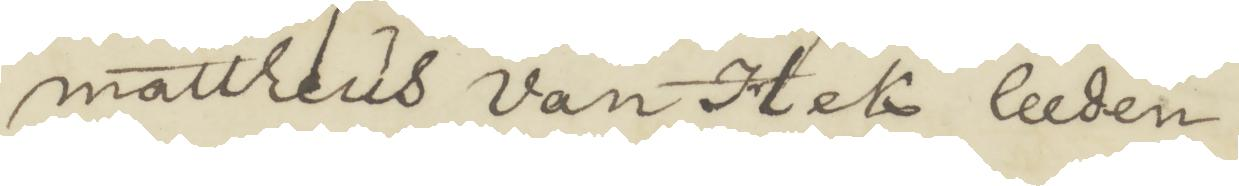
mattheus van Hek leeden
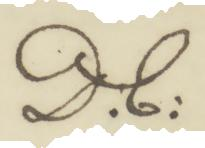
D: E:
